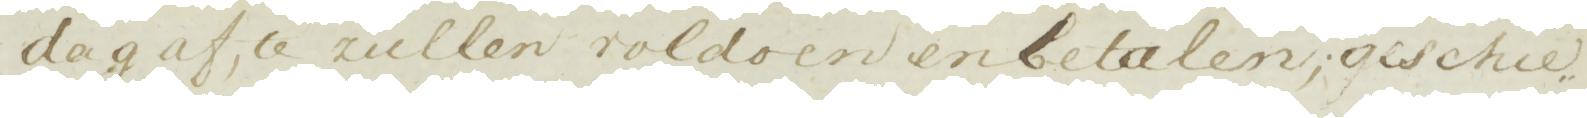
dag af, te zullen voldoen en betalen, geschie„
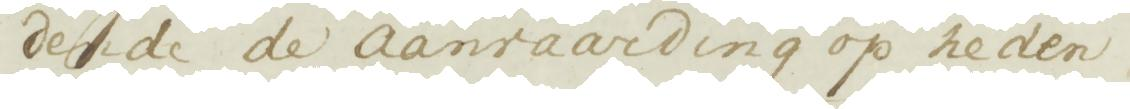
dende de aanvaarding op heden
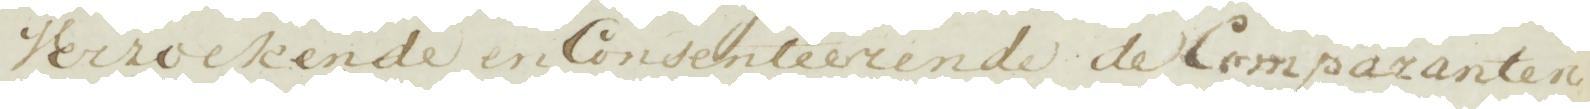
Verzoekende en Consenteerende, de Comparanten
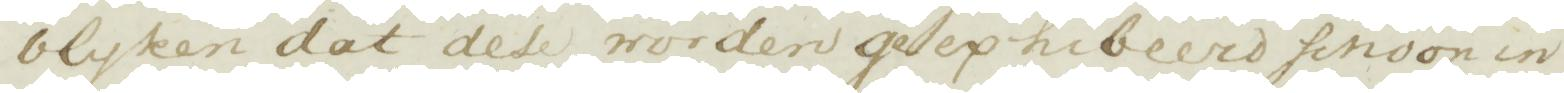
blyken dat dese worden geexhibeerd schoon in
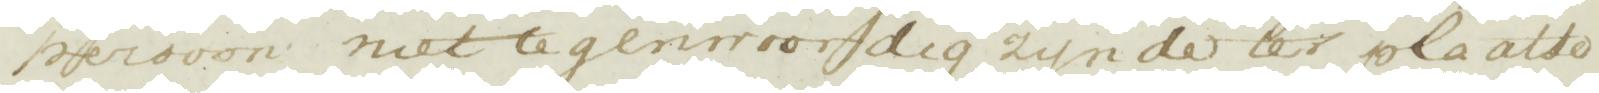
persoon niet tegenwoordig zijnde ter plaatse
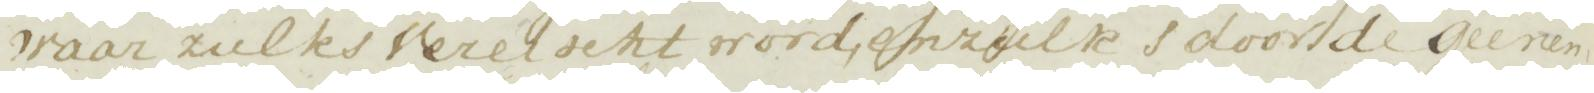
waar zulks vereischt word, en zulk s door de geenen
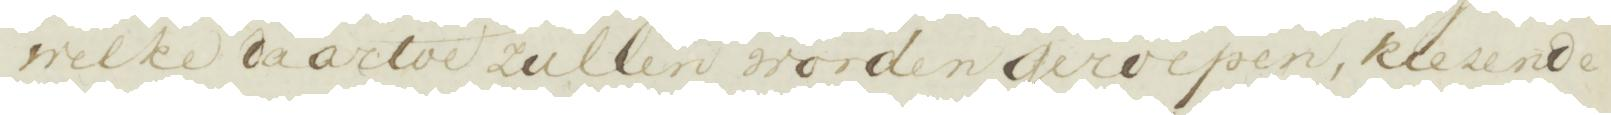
welke daartoe zullen worden geroepen, kiezende
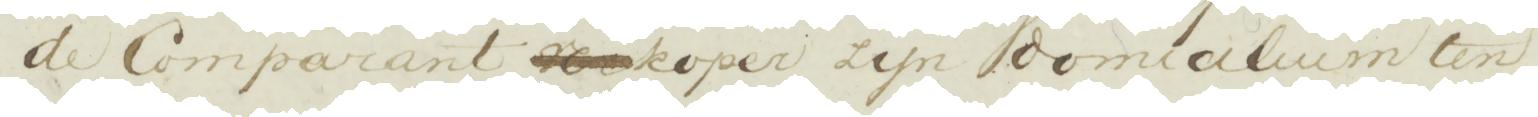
de Comparant verkoper zijn domicilium ten
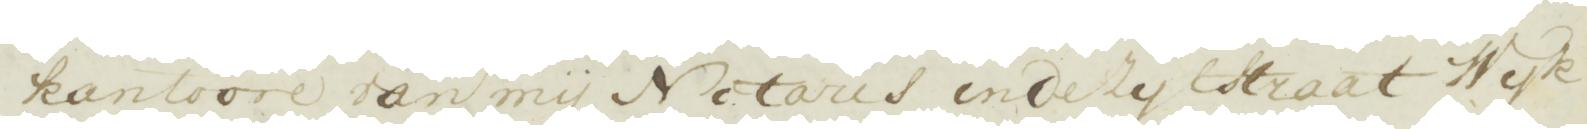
kantoore van mij Notaris in de Zylstraat Wyk
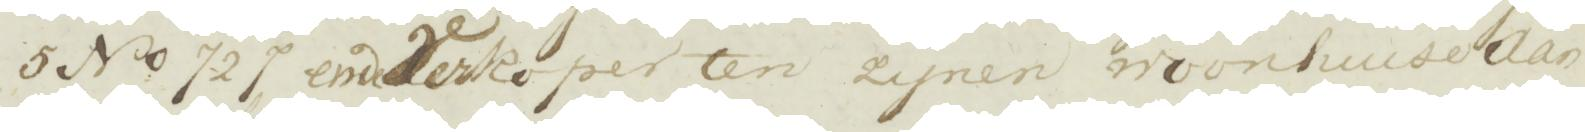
5 N.o 727 ende Verkoper ten zynen woonhuise aan
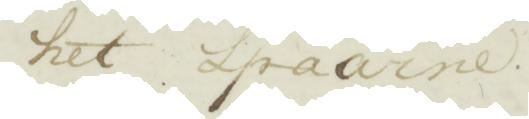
het spaarne
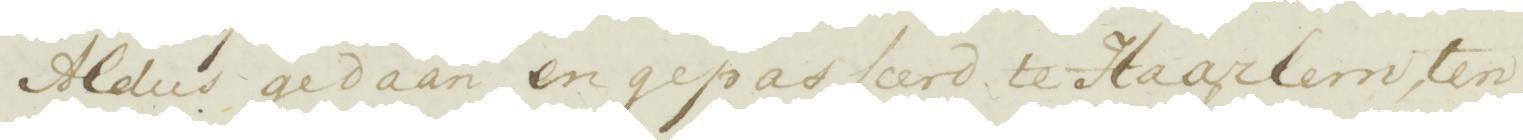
Aldus gedaan en gepasseerd, te Haarlem, ten
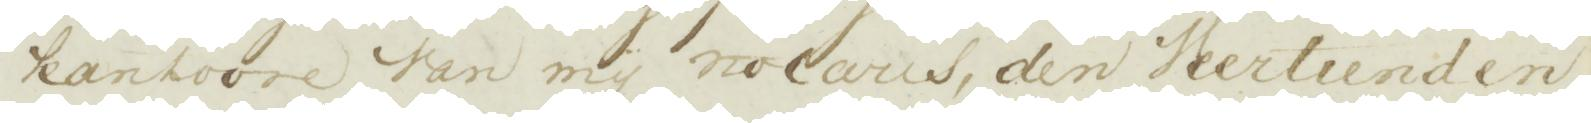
kantoore van mij notaris, den Veertienden
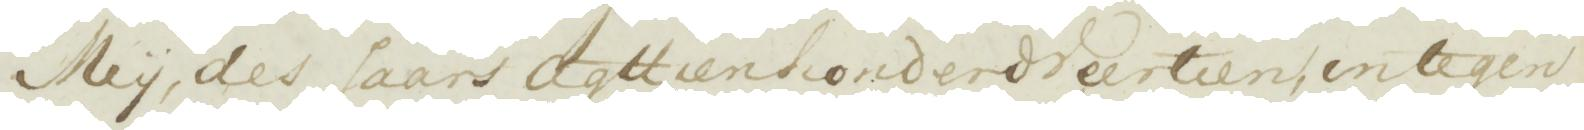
Meij, des Jaars Agttienhonderd Veertien, in tegen
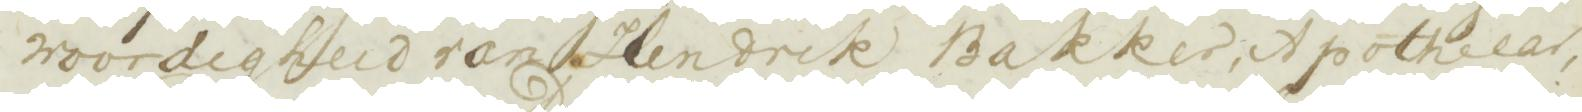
woordigheid van Hendrik Bakker, Apothecar,
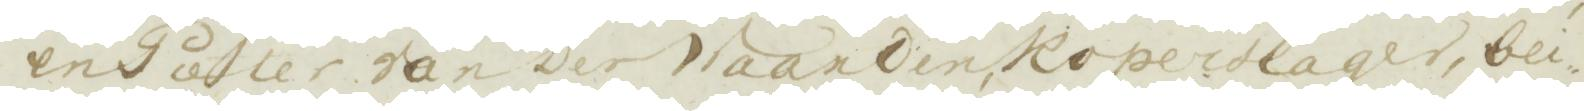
en Pieter van der Waarden, koperslager, bei
